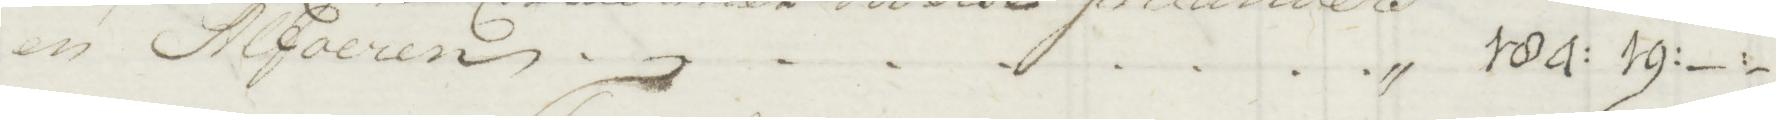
en Alfoeren . . - - - . . . . „ 184: 19:—:-
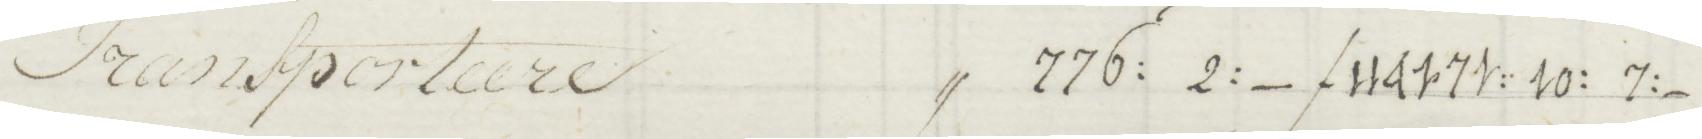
Transporteere „ 776: 2:— ƒ114171: 10:7:–
